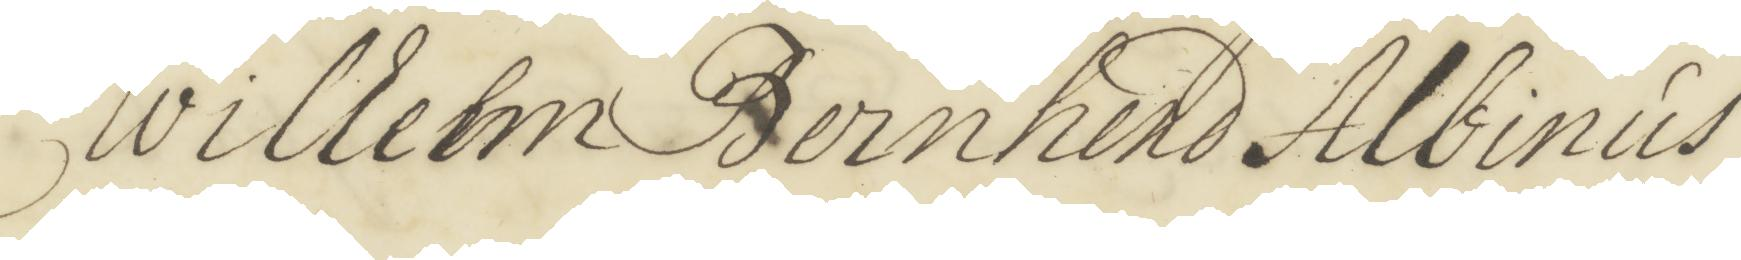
Willelm Bernherd Albinus
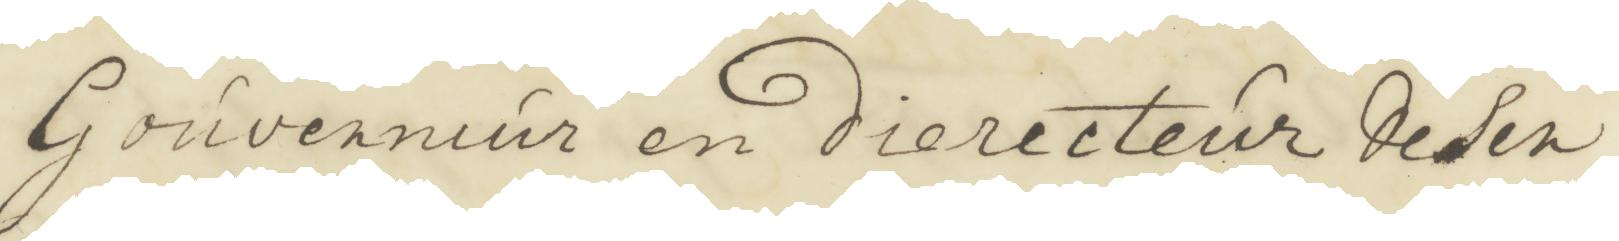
Gouverneur en dierecteur deser
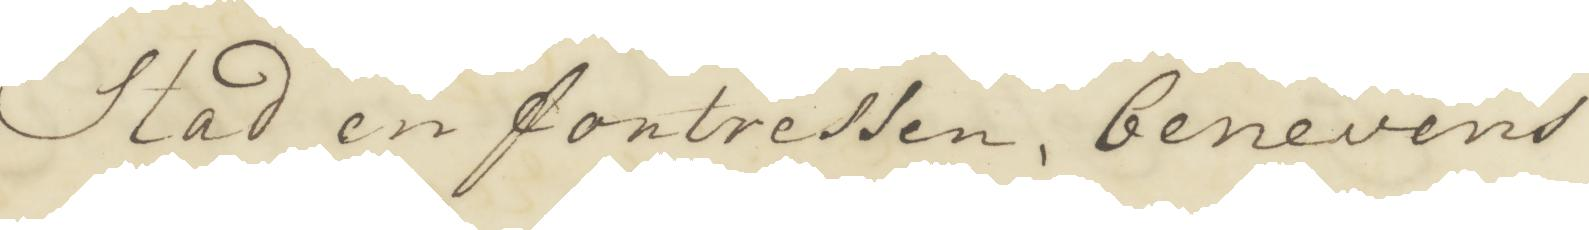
stad en fortressen, benevens
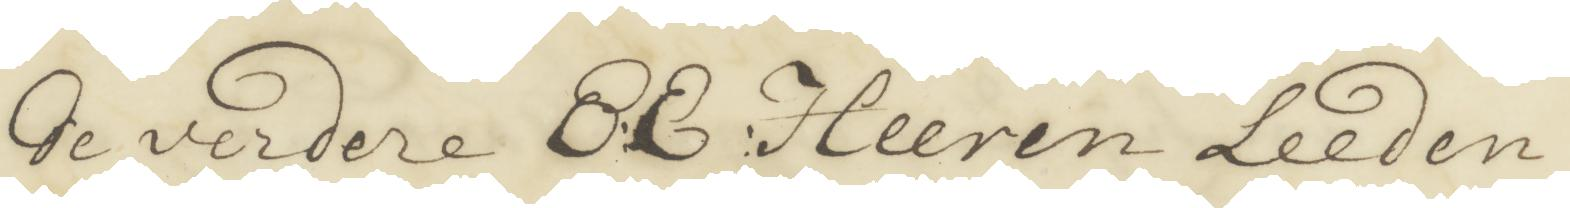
de verdere E:E: Heeren leeden
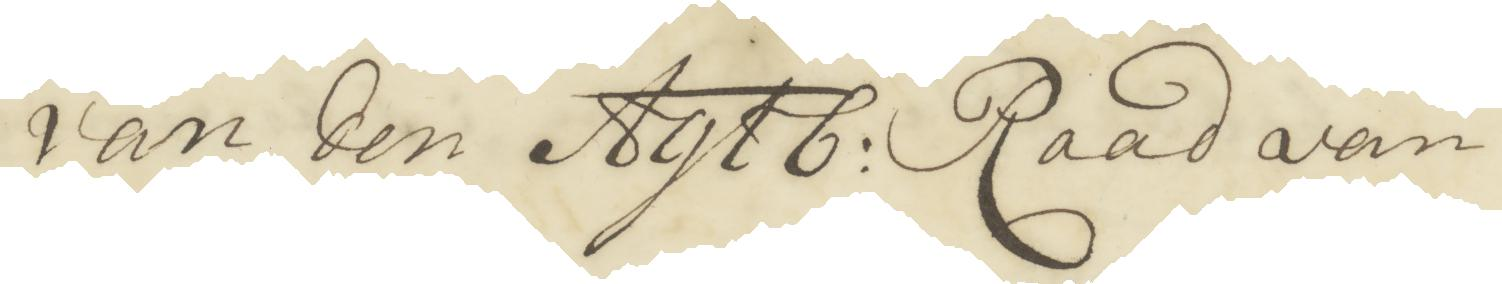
van den Agtb: Raad van
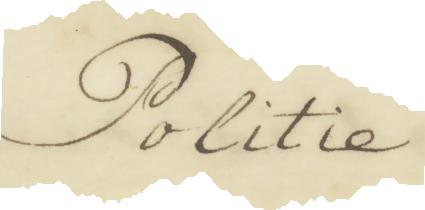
Politie
